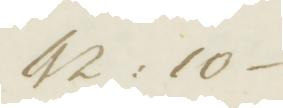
42: 10 —
